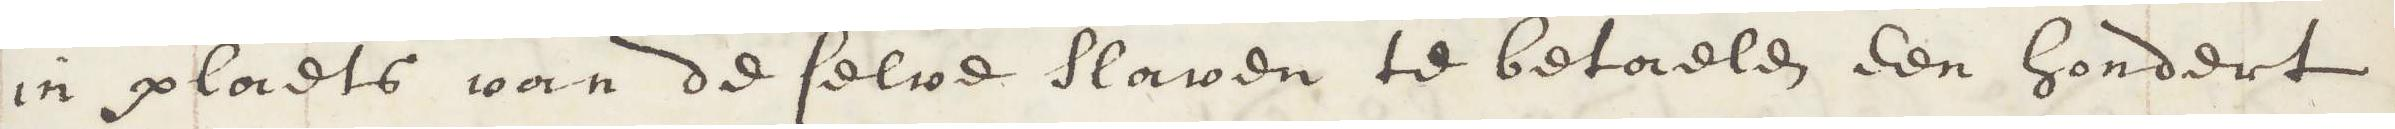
in plaets van de selve slaven te betaelen een hondert
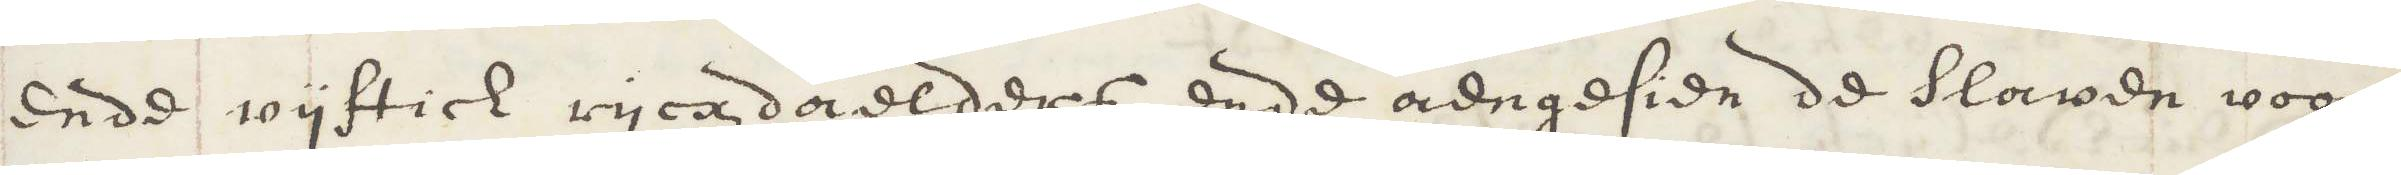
ende vijftich rijcxdaelders, ende aengesien de slaven voor
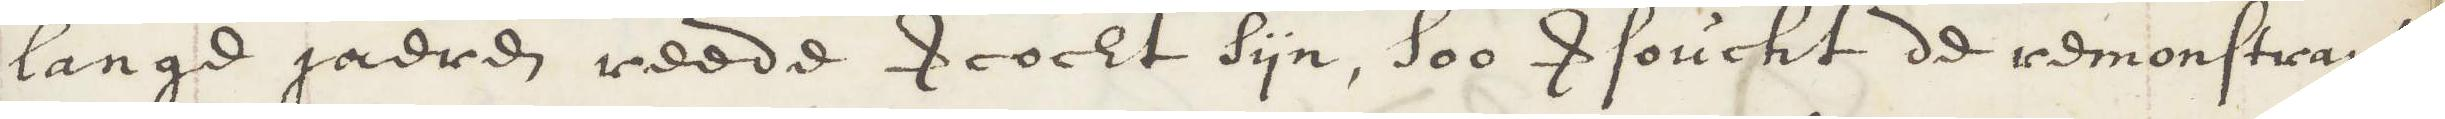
lange jaeren reede vercocht sijn, soo versouckt de remonstrante
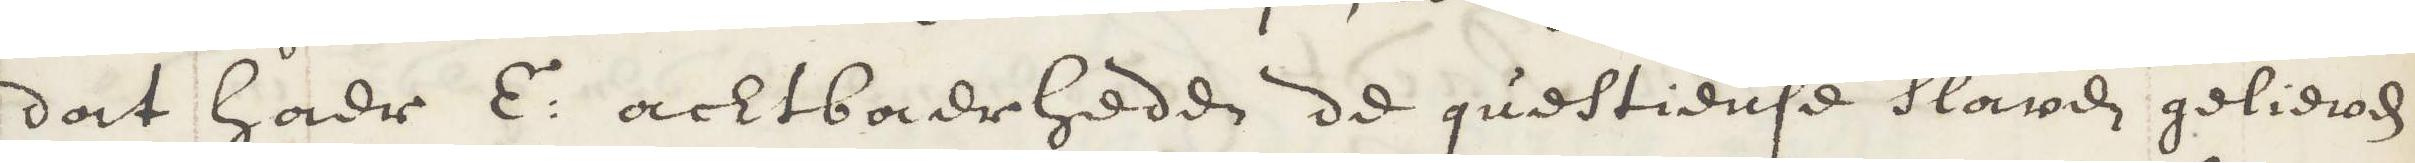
dat haer E: achtbaerheden de questieuse slaven gelieven
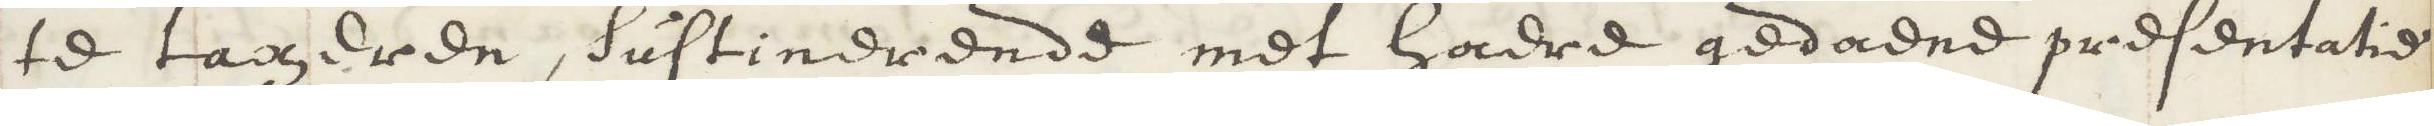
te taxeren, sustinerende met haere gedaene presentatie
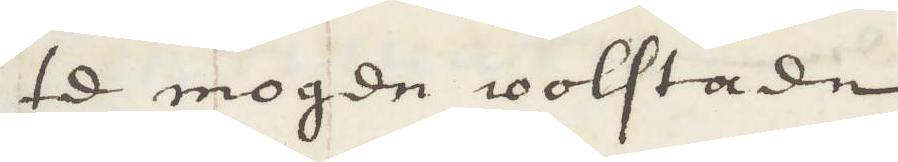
te mogen volstaen
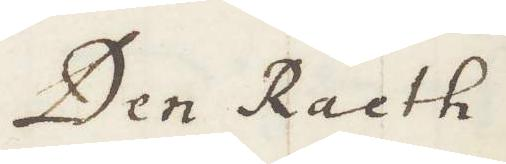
Den Raeth
